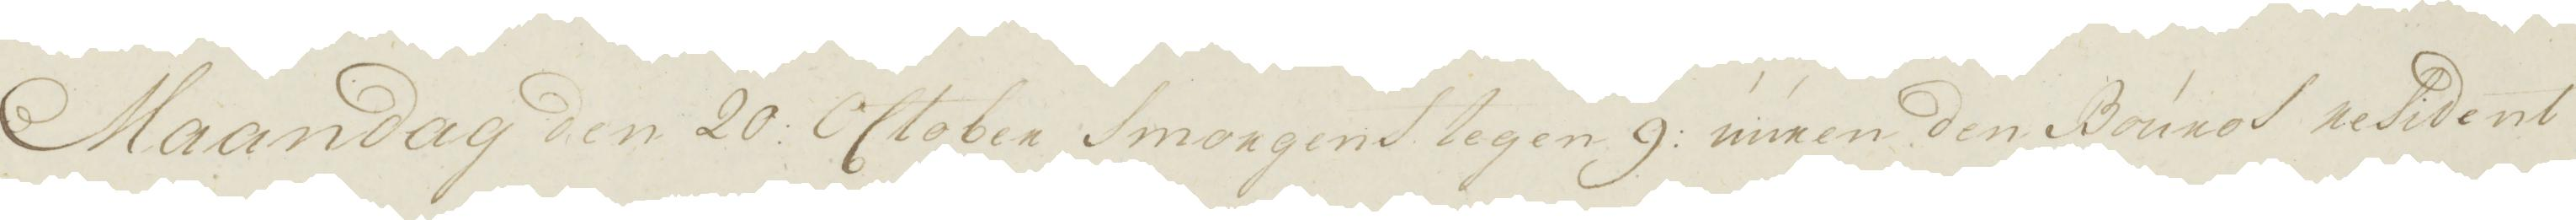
Maandag den 20: October smorgens tegen 9: uuren den Bouros resident
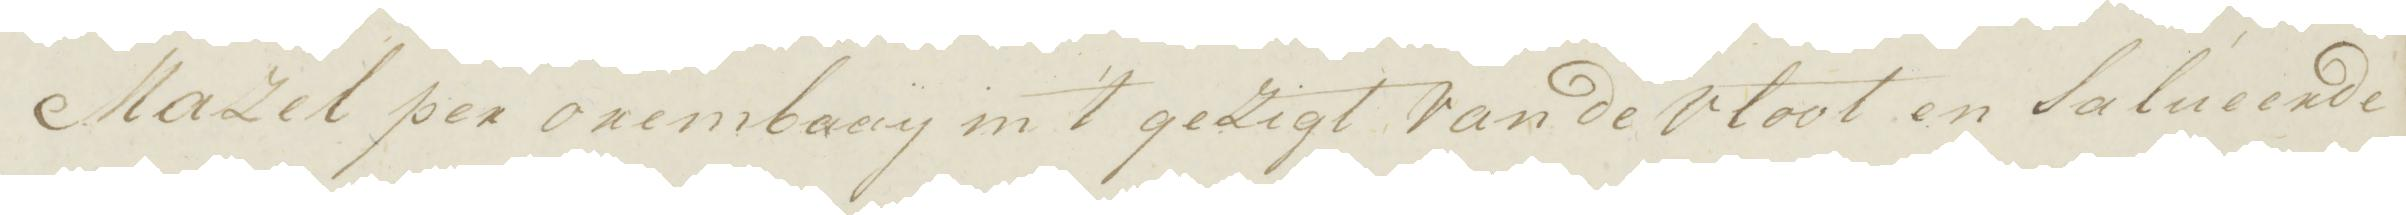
Mazel per orembaaij in ’t gezigt van de vloot en salueerde
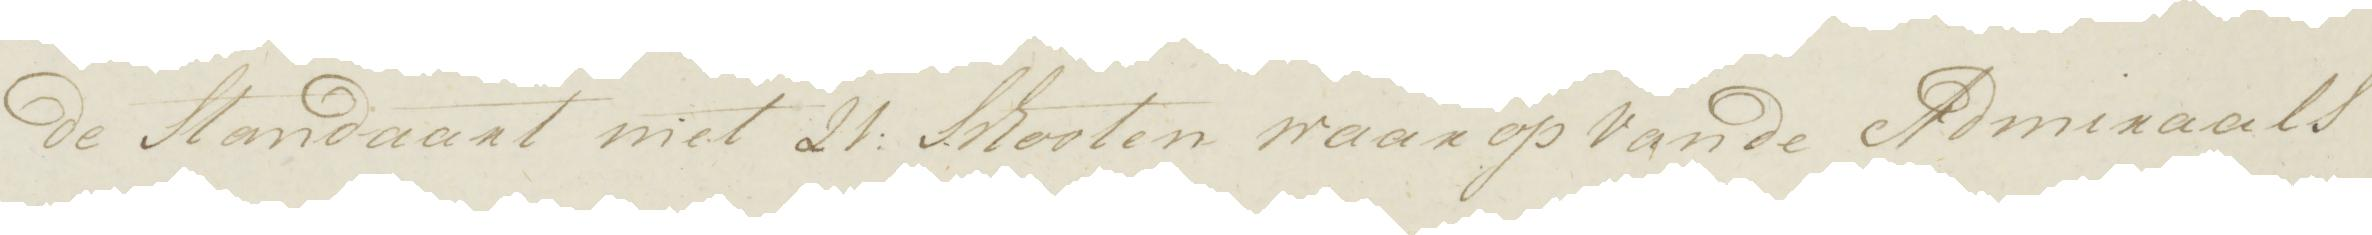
de standaart met 21: schooten waar op van de Admiraals
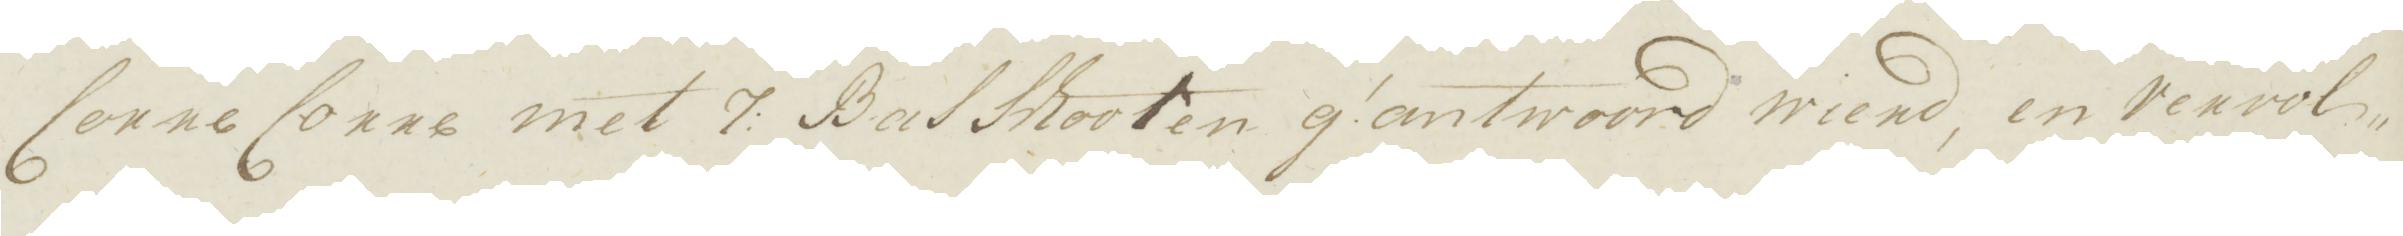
Corre Corre met 7: Bas schooten g’antwoord wierd, en vervol„
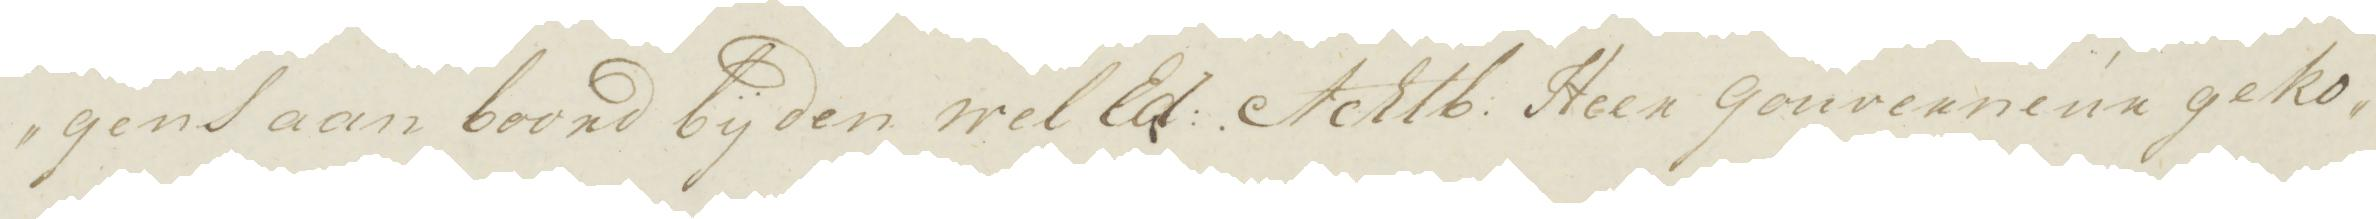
„gens aan boord bij den wel Ed: Achtb: Heer gouverneur geko„
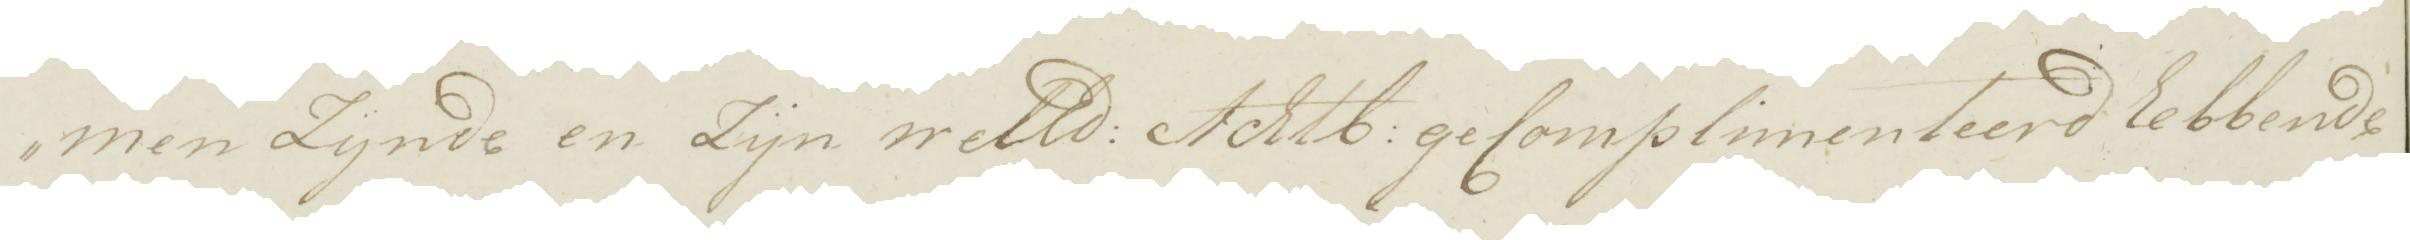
„men zijnde en zijn welEd: Achtb: gecomplimenteerd hebbende
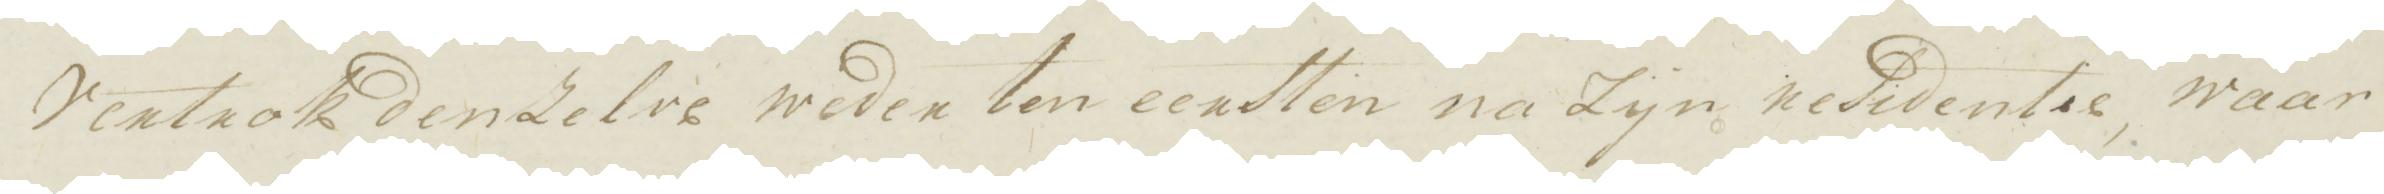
vertrok denzelve weder ten eersten na zijn residentie, waar
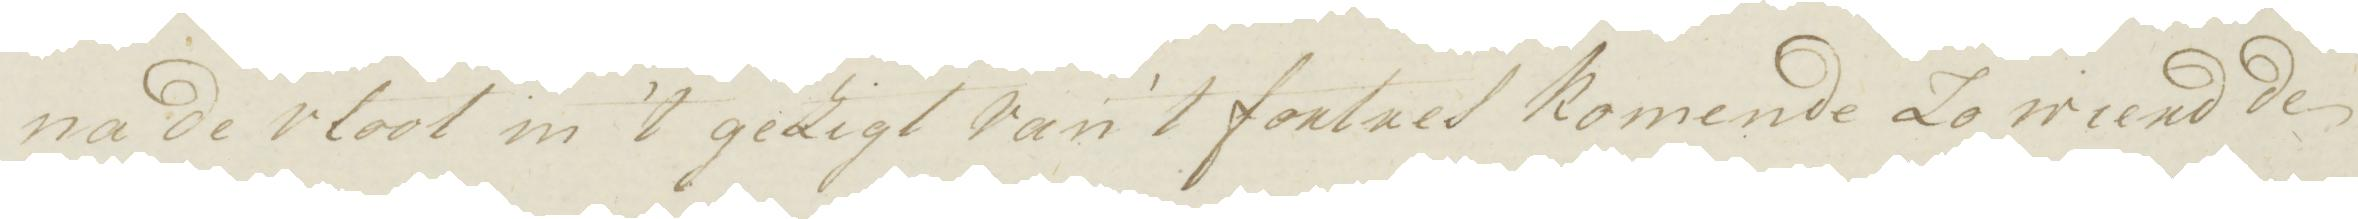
na de vloot in ’t gezigt van ’t fortres komende zo wierd de
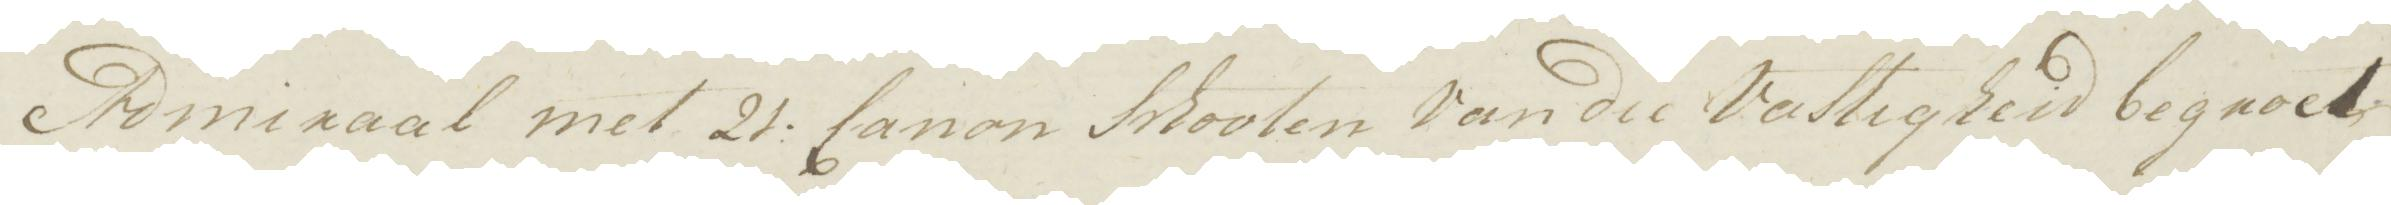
Admiraal met 21: canon schooten van die vastigheid begroet
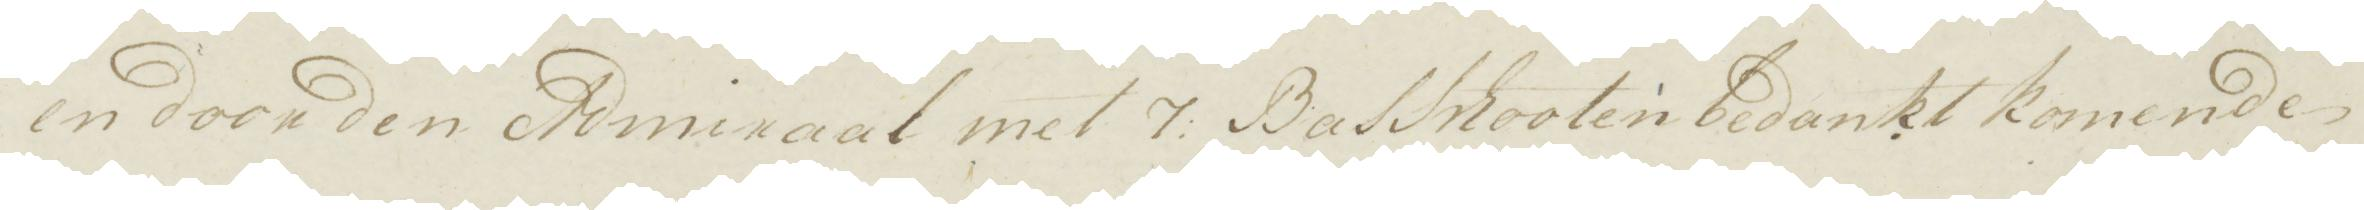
en door den Admiraal met 7: Basschooten bedankt komende
